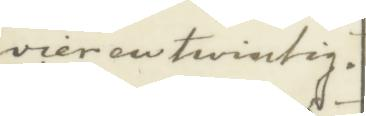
vier en twintig.
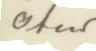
sten
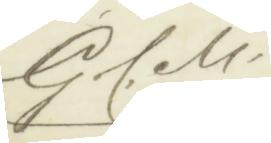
G C.M,
